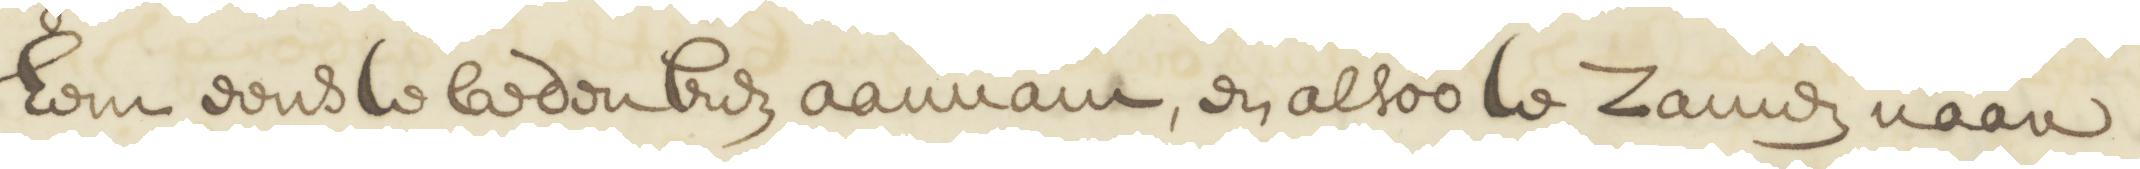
hem eens te bedenken aannam, en alsoo te zamen naar
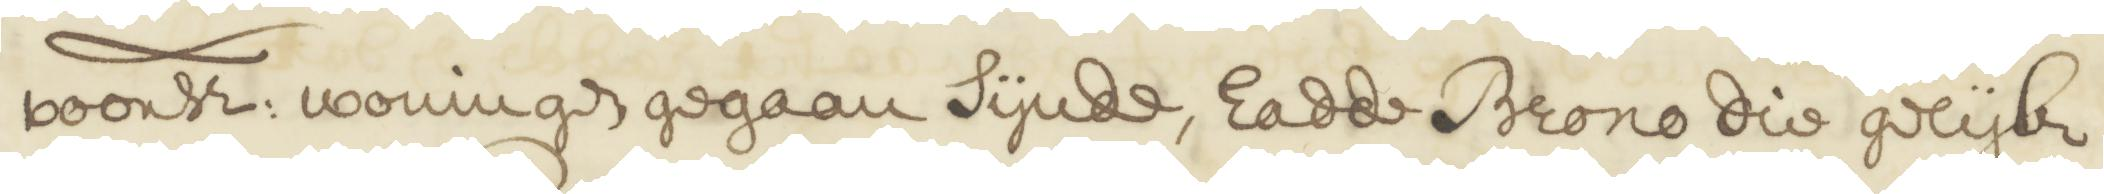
voorsz: woningen gegaan sijnde, hadde Brono die gelijk
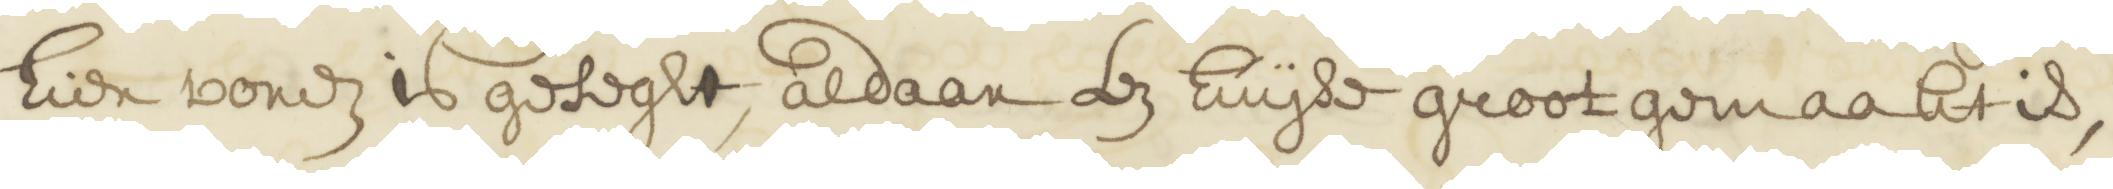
hier voren is geseght, aldaar ten huijse groot gemaakt is,
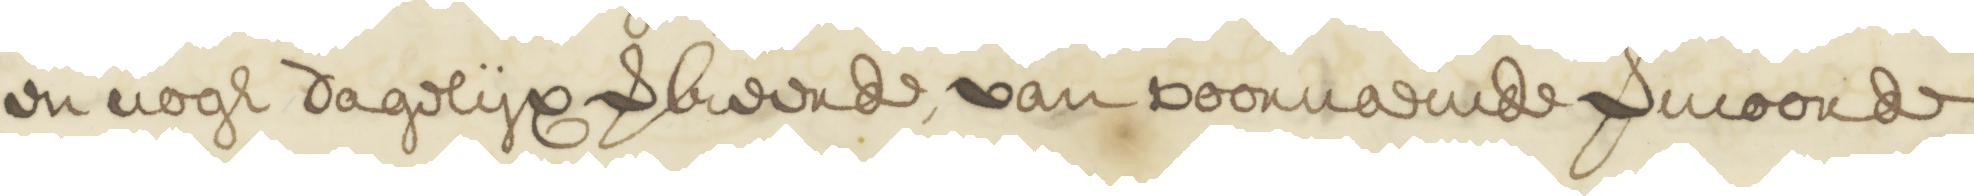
en nogh dagelijx verkeerde, van voornoemde vermoorde
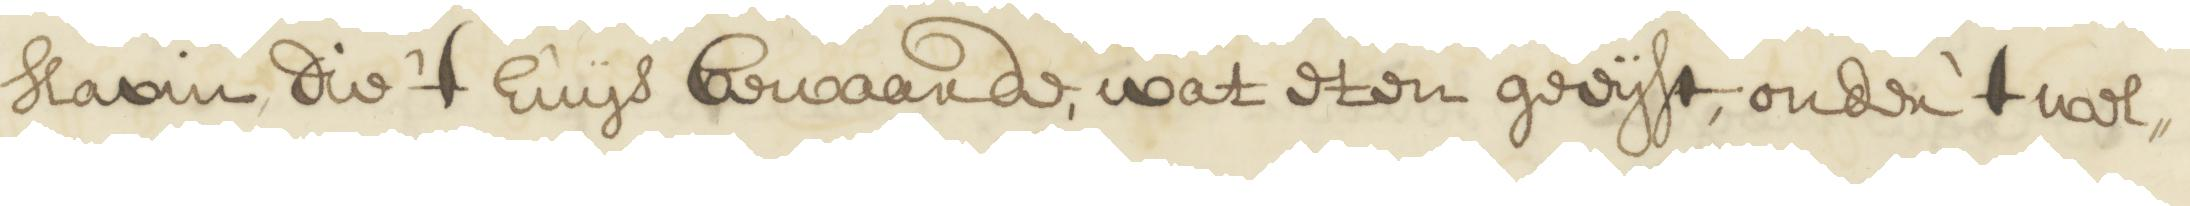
slavin, die ’t huijs bewaarde, wat eten geeijst, onder ’t wel„
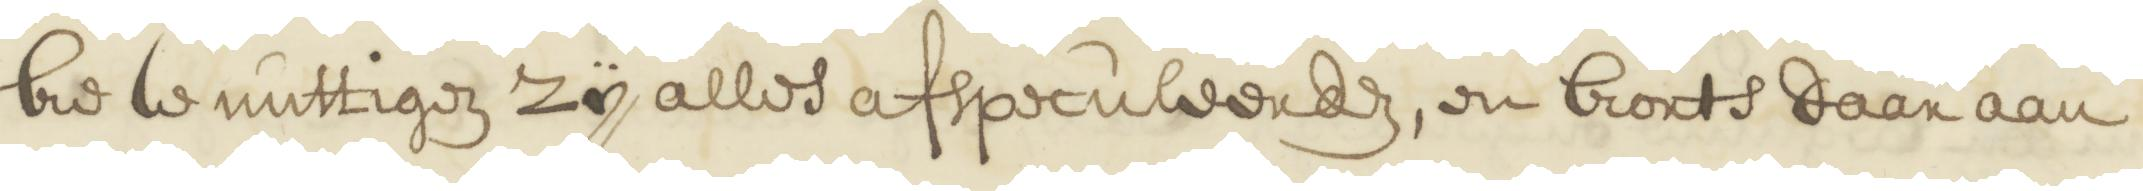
ke te nuttigen zij alles afspeculeerden, en korts daar aan
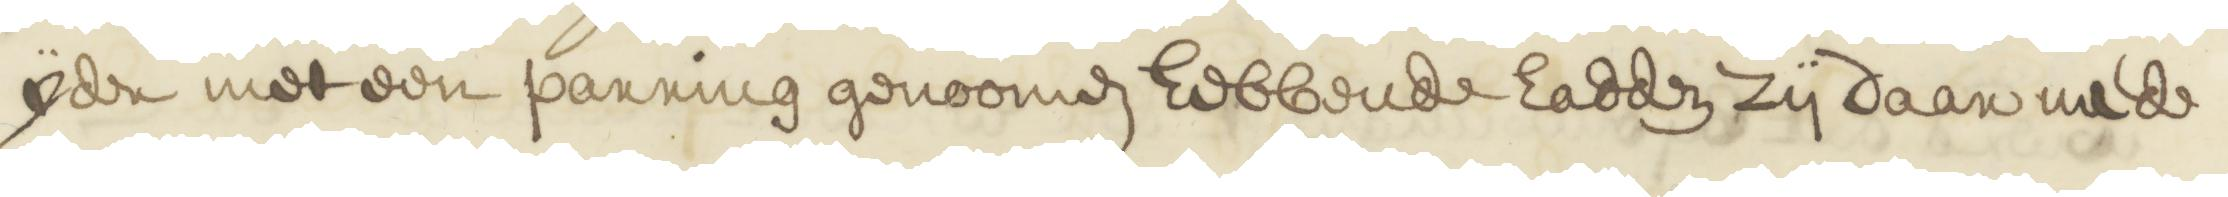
ijder met een parring genoomen hebbende hadden zij daar mede
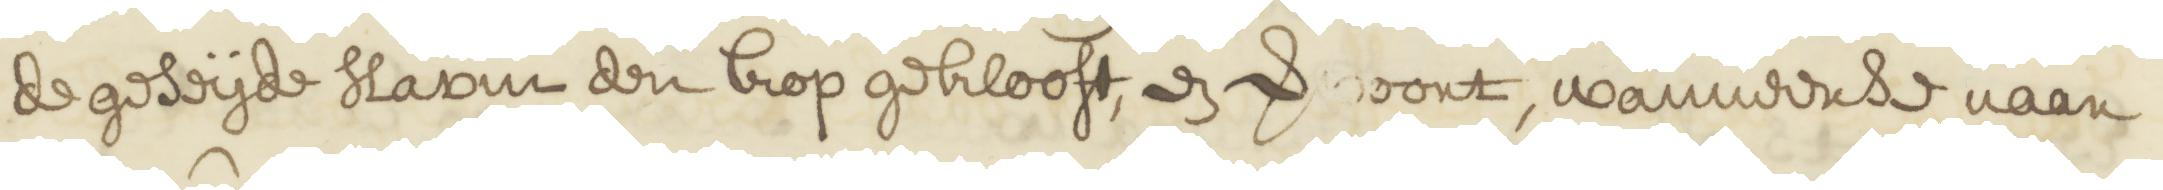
de geseijde slavin den kop geklooft, en vervoort, wanneerse naar
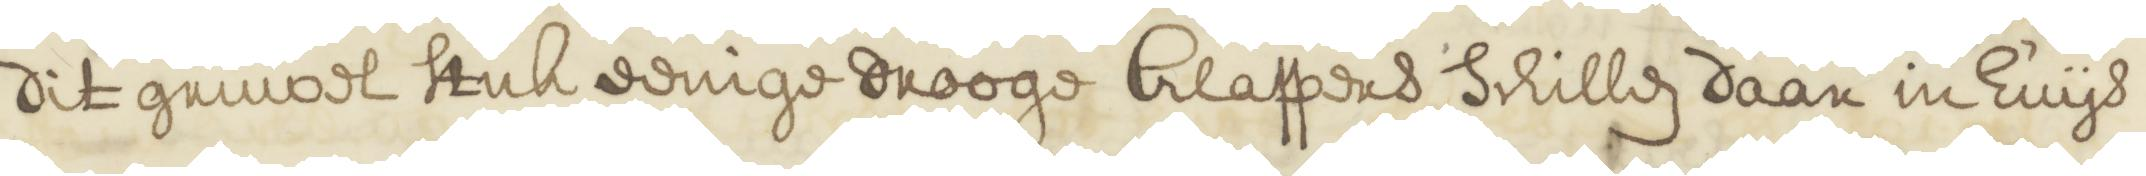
dit gruwel stuk eenige drooge klappers schillen daar in huijs
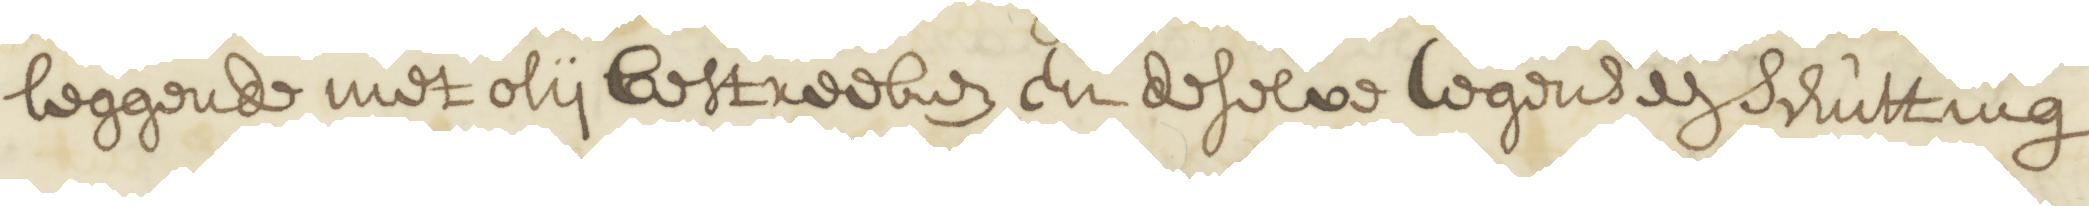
leggende met olij bestreeken en deselve tegens een schutting
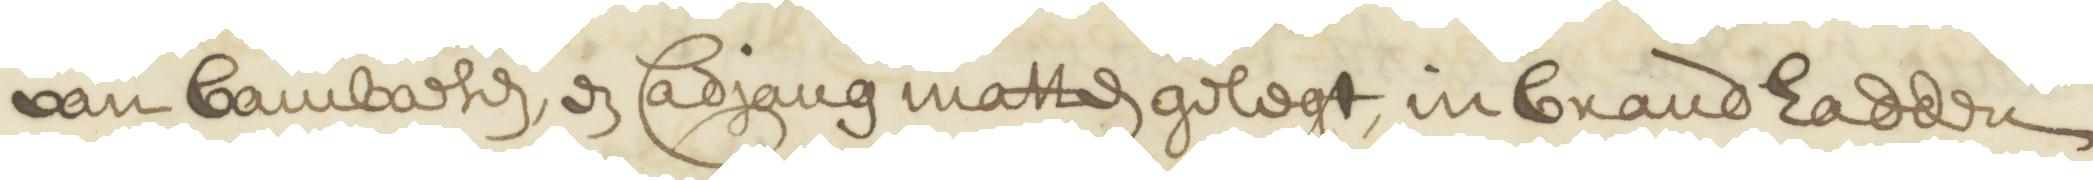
van bamboesen, en Cadjang matten gelegt, in brand hadden
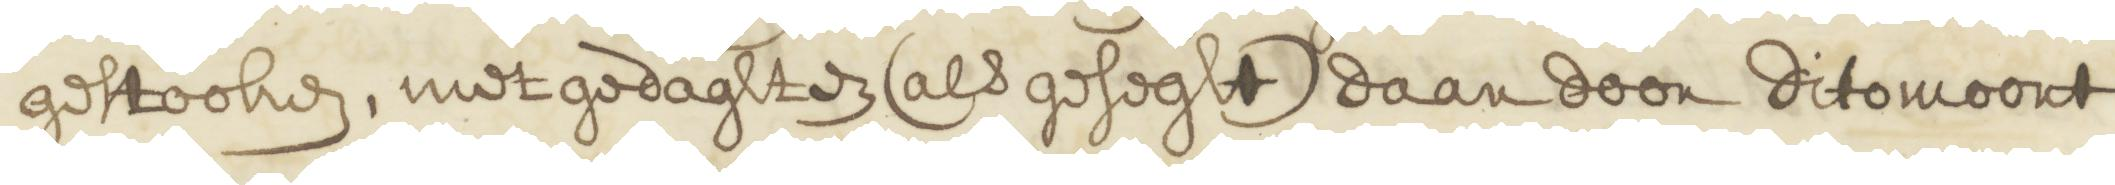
gestooken, met gedaghten (als geseght) daar door dito moort
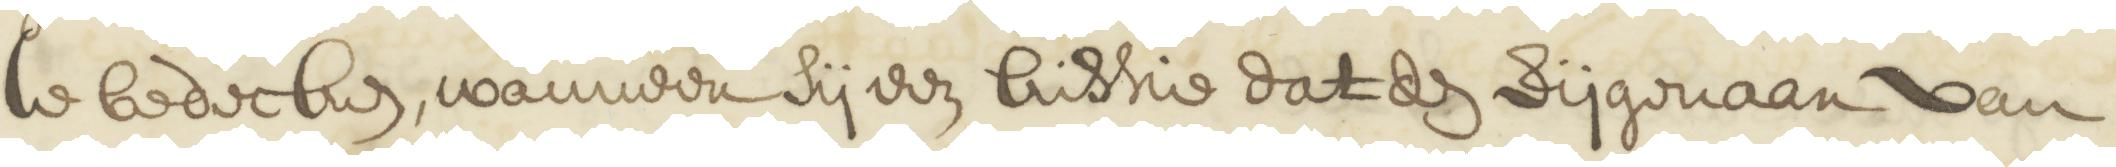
te bedecken, wanneer sij een kissie dat den Eijgenaar van
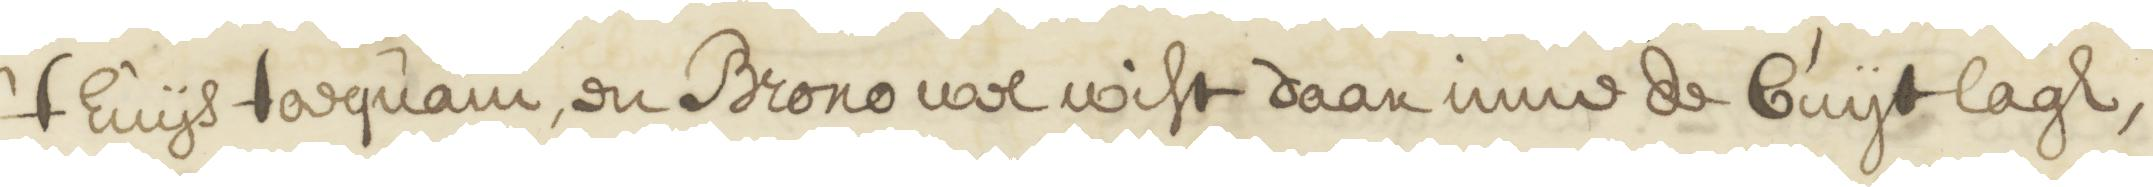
’t huijs toequam, en Brono wel wist daar inne de buijt lagh,
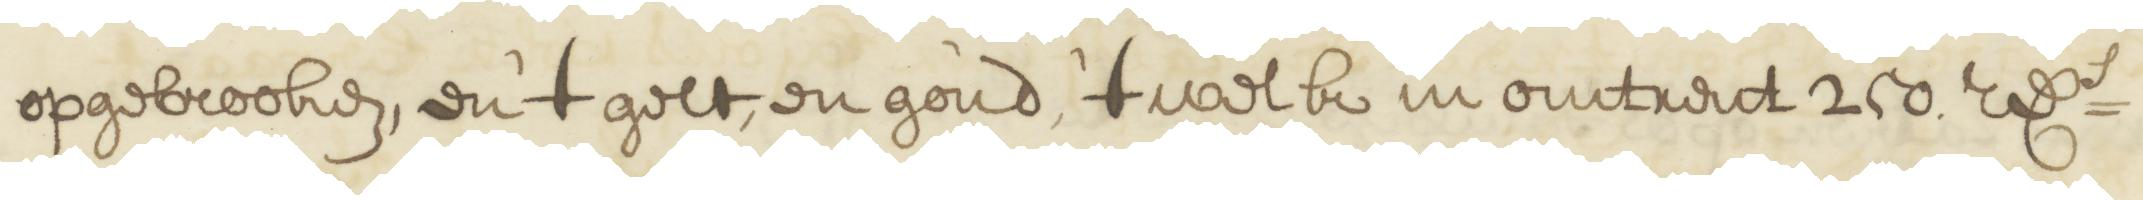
opgebrooken, en ’t gelt, en goud, 't welk in omtrent 250. rx=s
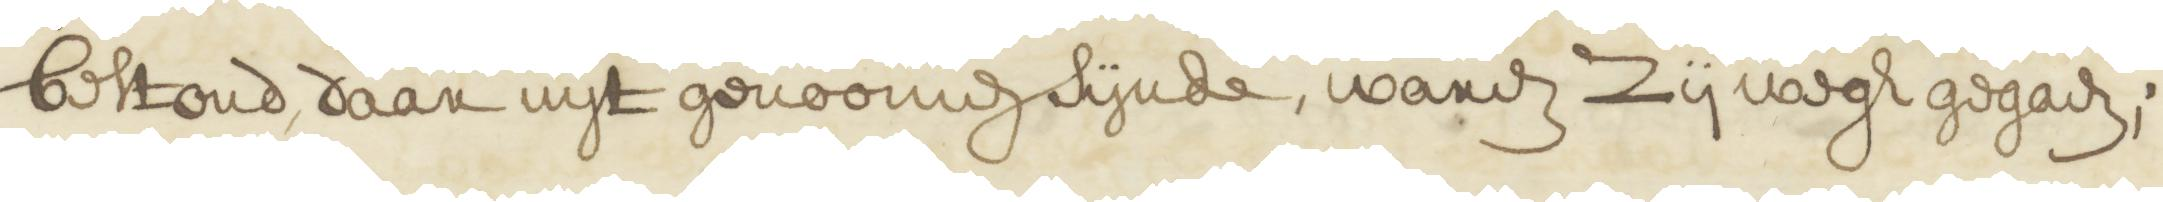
bestond, daar uijt genoomen sijnde, waren zij wegh gegaen;
